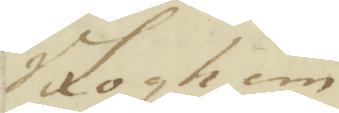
V Loghem
